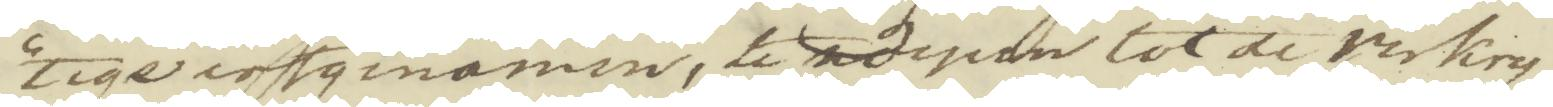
tige erfgenamen, te roepen tot de verkry
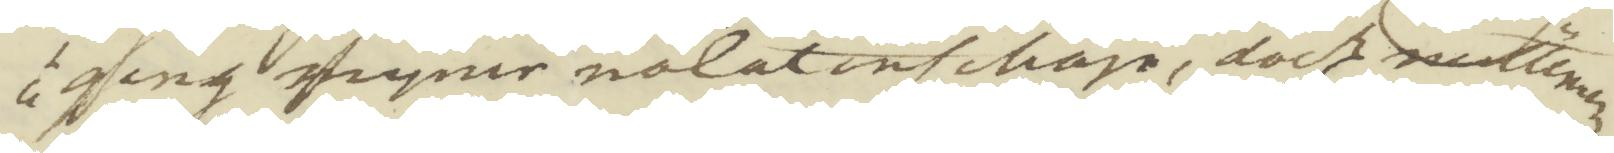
ging myner nalatenschap, doch niettemin
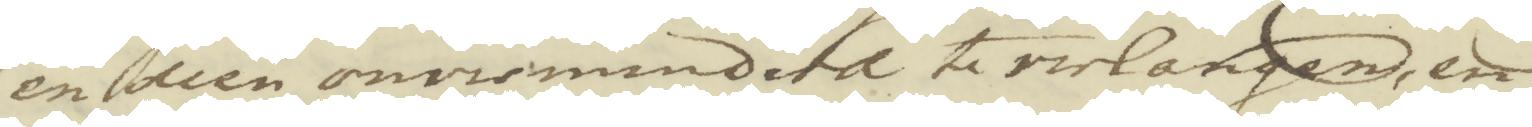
en dien onverminderd te verlangen, en
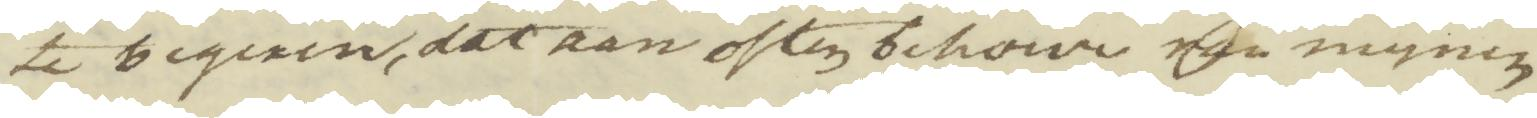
te begeren, dat aan often behoeve van mynen
